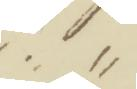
1: „
